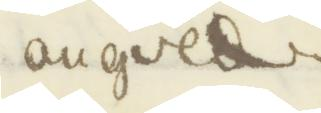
ongelden
